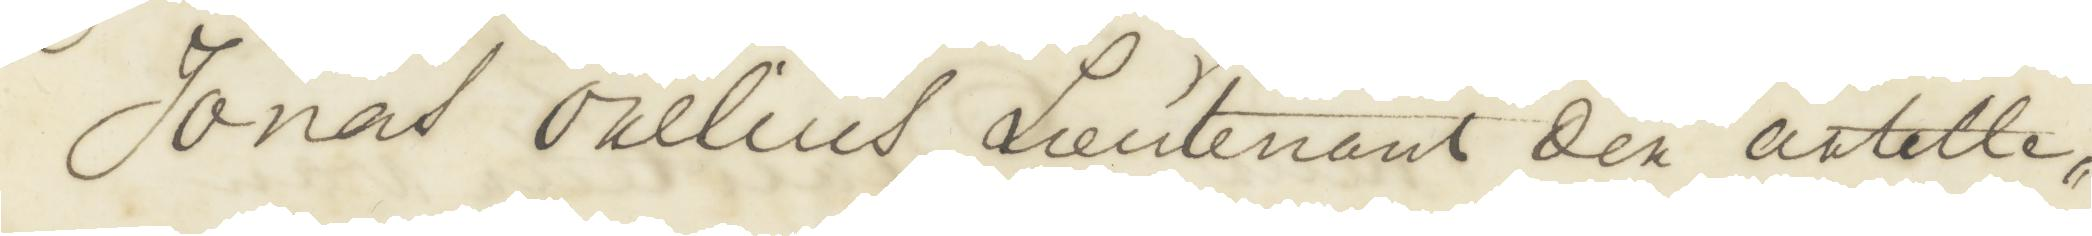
Jonas orelius Lieutenant der artille„
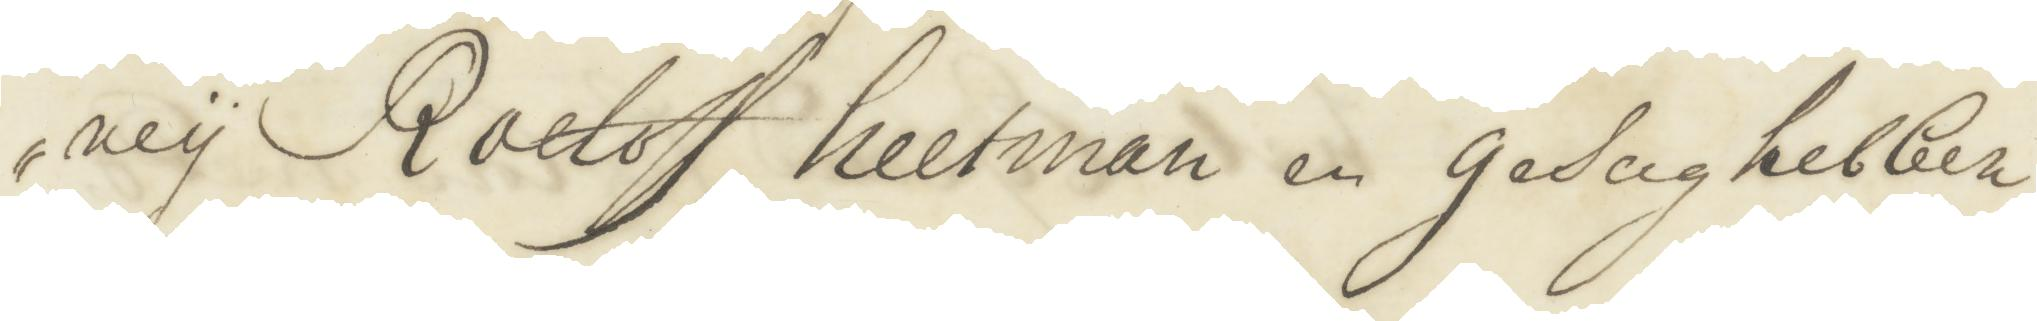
„reij Roeloff heetman en gesaghebber
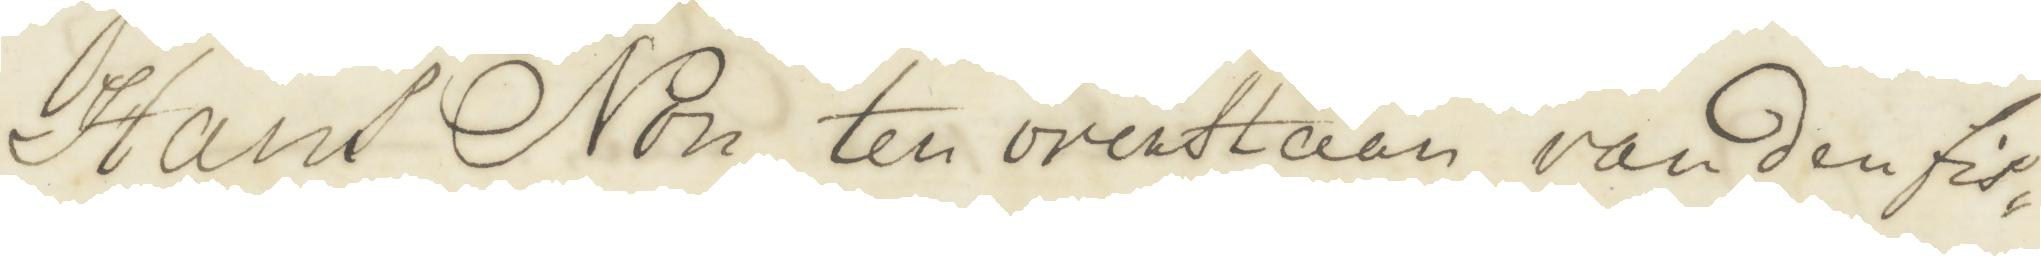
Hans Non ten overstaan van den fis„
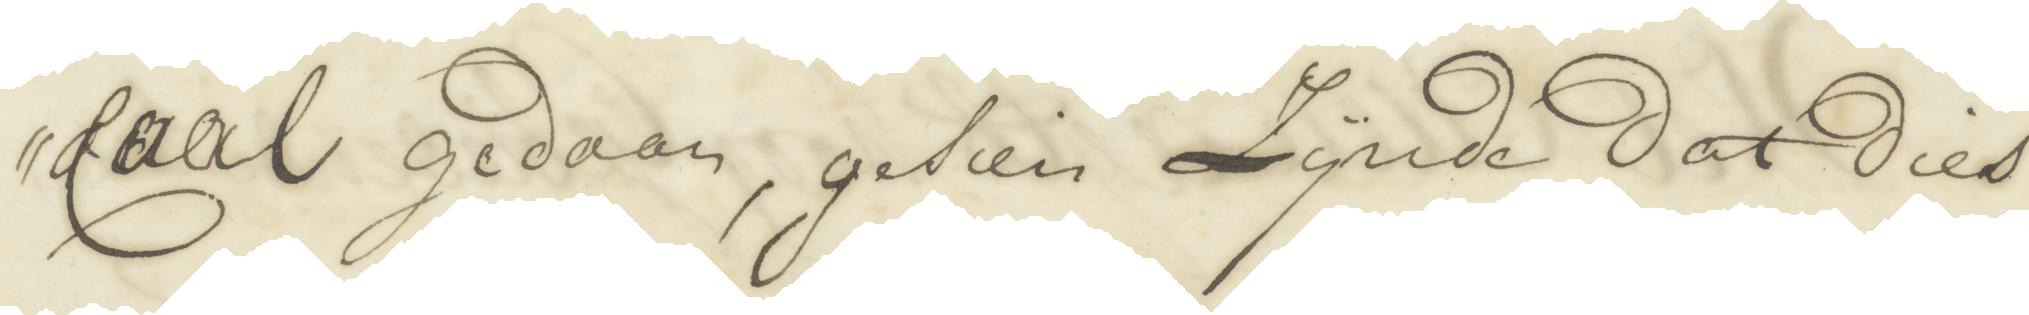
„Caal gedaan, gesien zijnde, dat dies
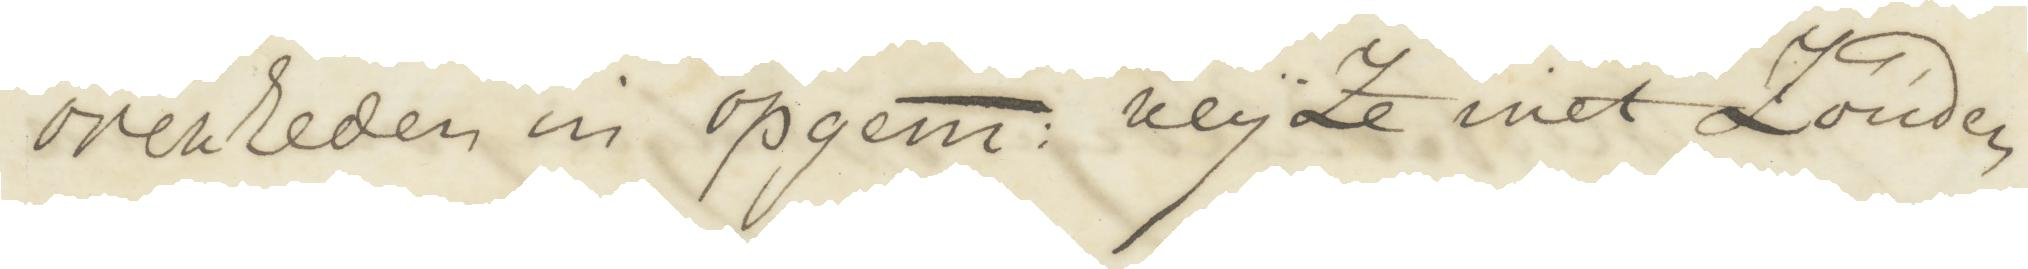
overheden in opgem: reijze niet zouden
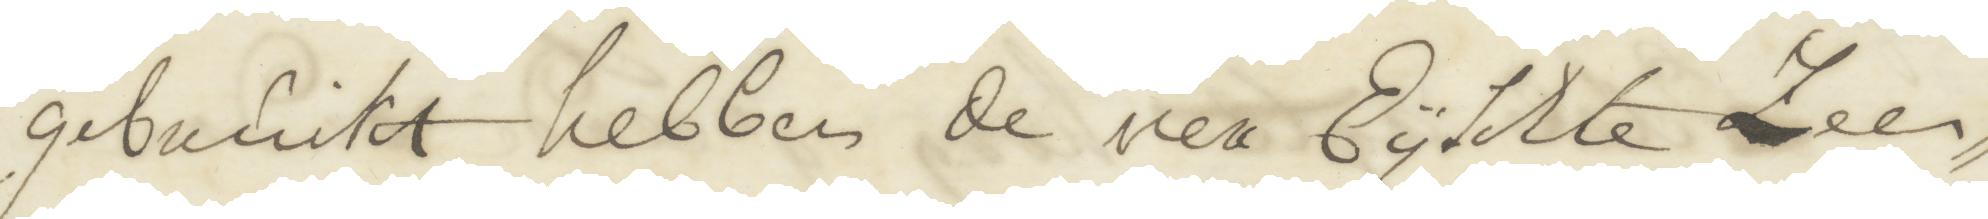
gebruikt hebben de ver Eijschte zee„
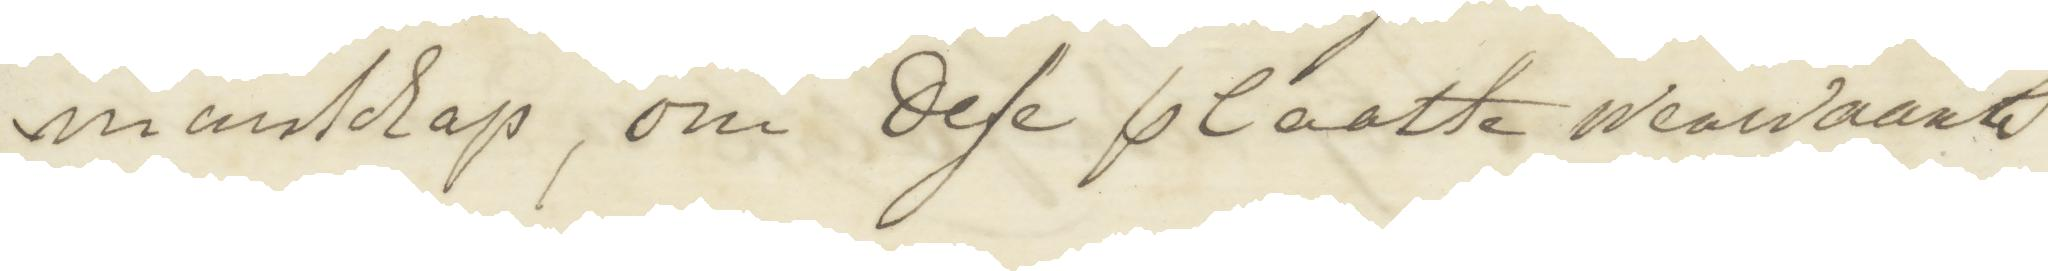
manschap, om dese plaatse werwaarts
